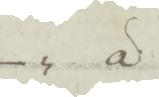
-„ a
